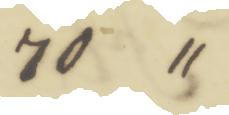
70 „
